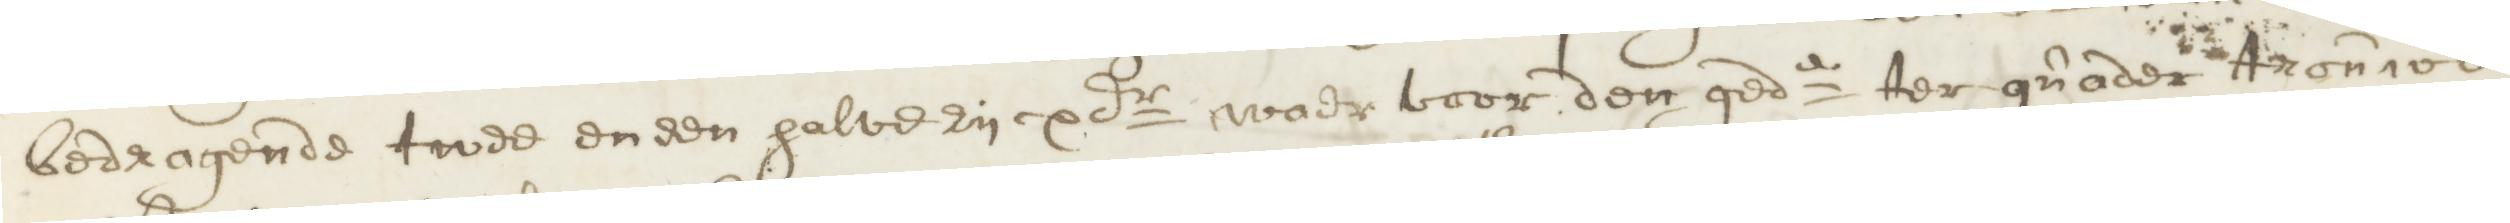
bedragende twee en een halve rijcxd=r waer voor den ged=e ter quader trouwe
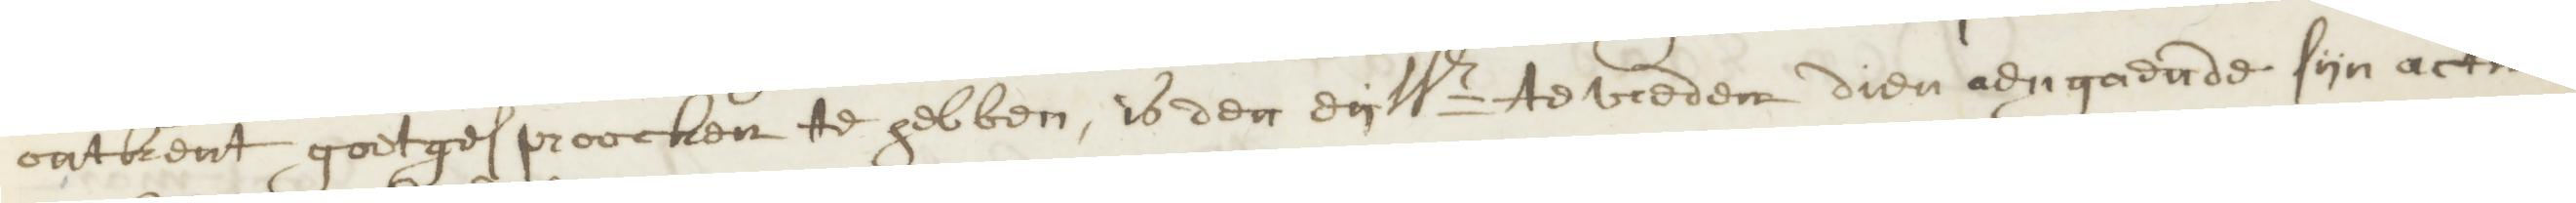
ontkent goetgesproocken te hebben, is den eijss=r te vreden dien aengaende sijn actie
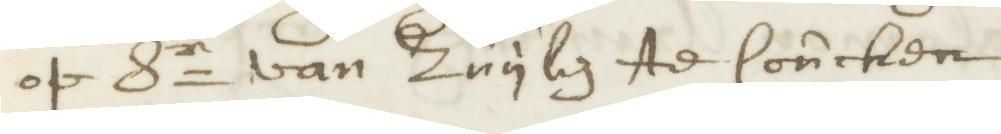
op H=r van Zuijlen te soucken
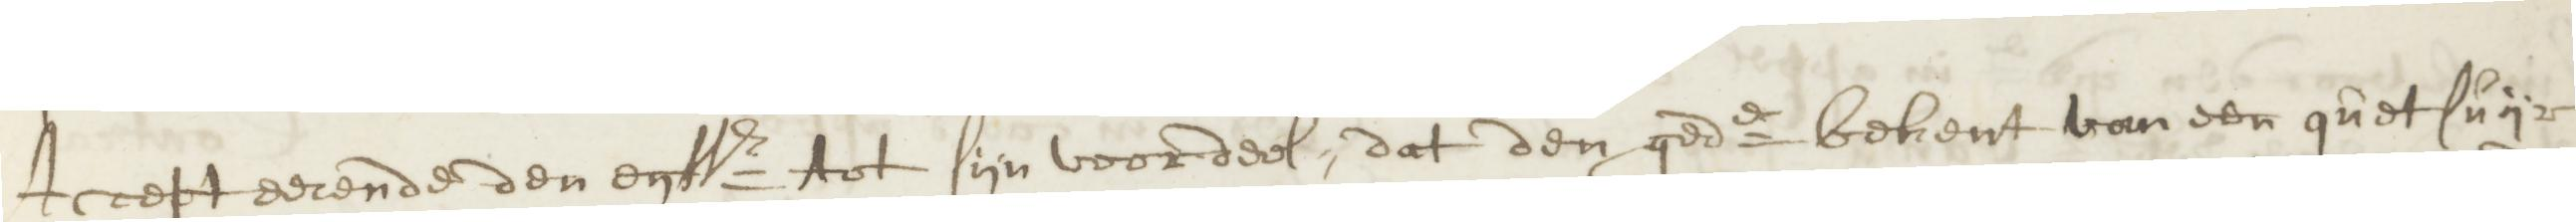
Accepteerende den eyss=r tot sijn voordeel, dat den ged=e bekent van een quetsuijr
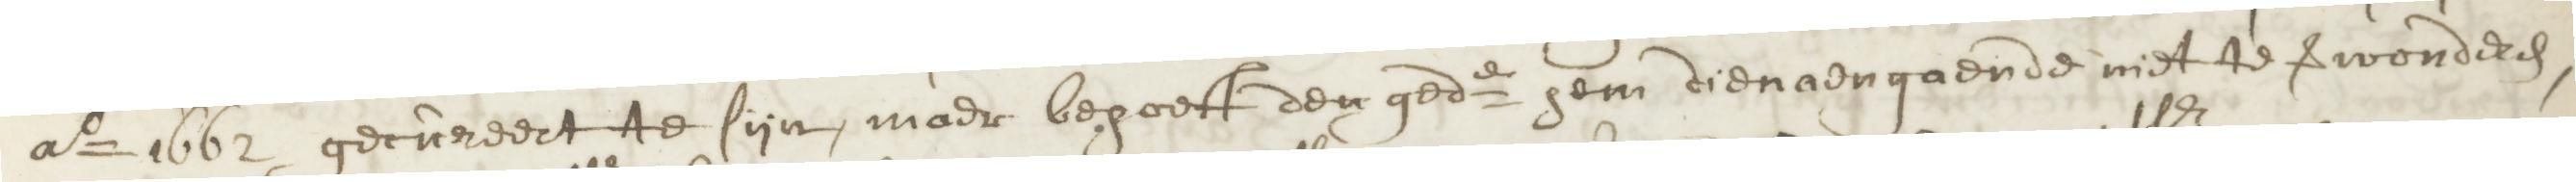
a=o 1662 gecureert te sijn, maer behoeft den ged=ee hem dienaengaende niet te verwonderen,
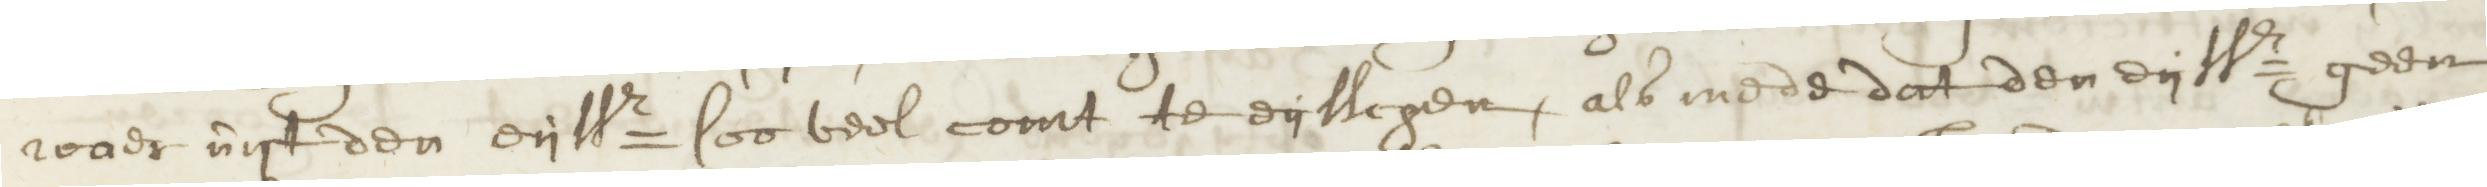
waer uijt den eijss=r soo veel comt te eijsschen, als mede dat den eijss=r geen
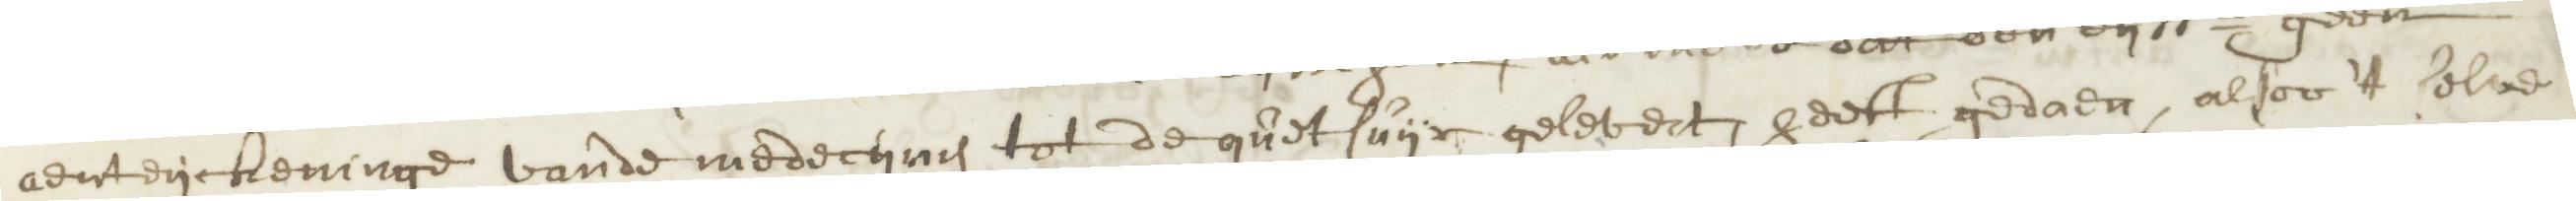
aenteijckeninge vande medecijns tot de quetsuijr gelevert, heeft gedaen, alsoo ’t selve
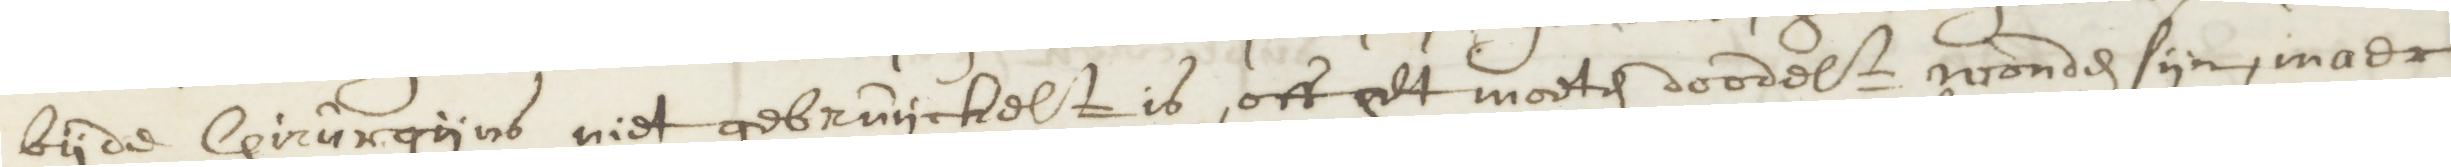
bij de Chirurgijns niet gebruijckelijk is, oft het moeten doodelijk wonden sijn, maer
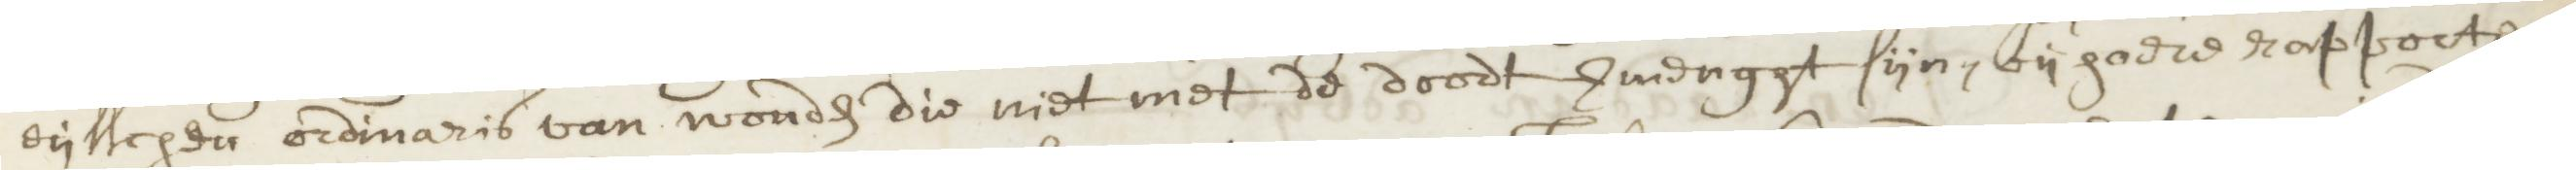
eijsschen ordinaris van wonden die niet met de doodt vermenght sijn, bij haere rapporten
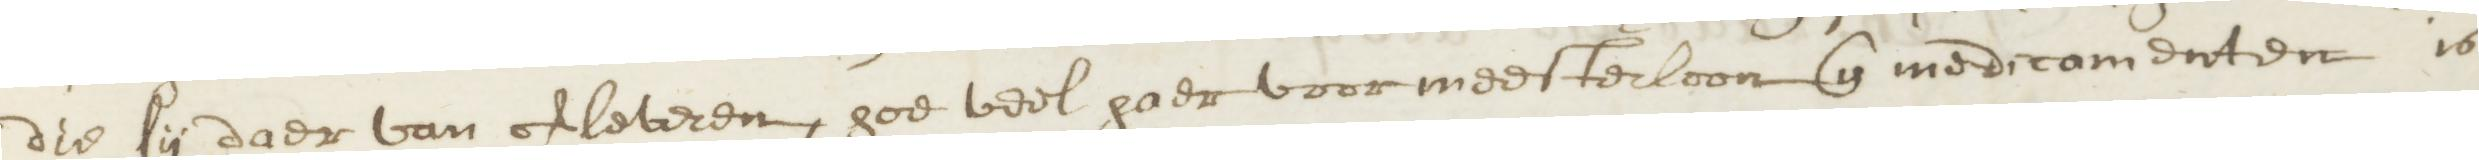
die sij daer van overleveren, hoe veel haer voor meesterloon ende medicamenten is
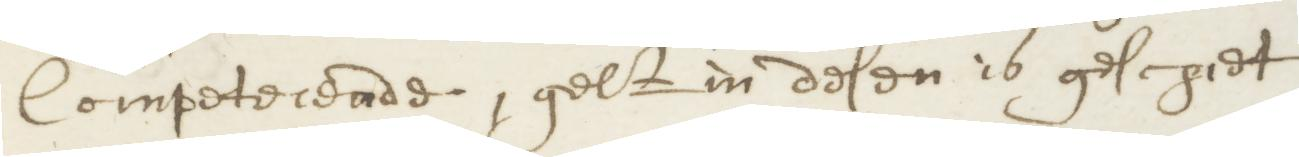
Competerende, gelijk in desen is geschiet
